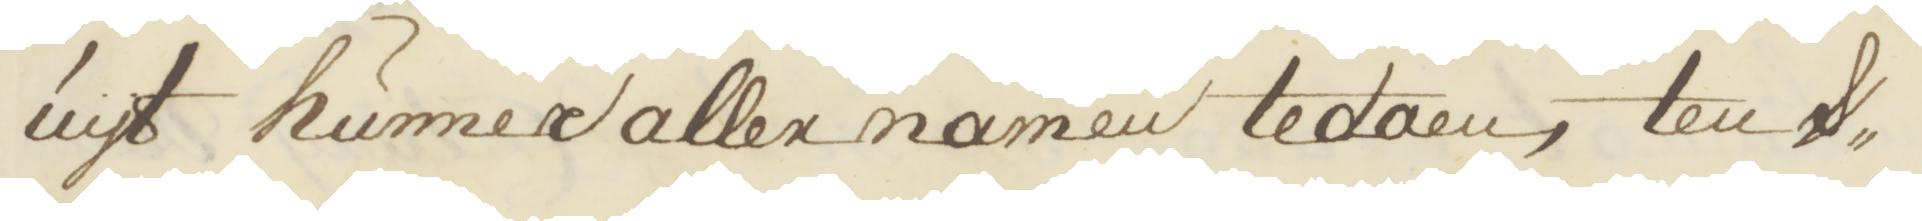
uijt hunner aller namen tedoen, ten ver„
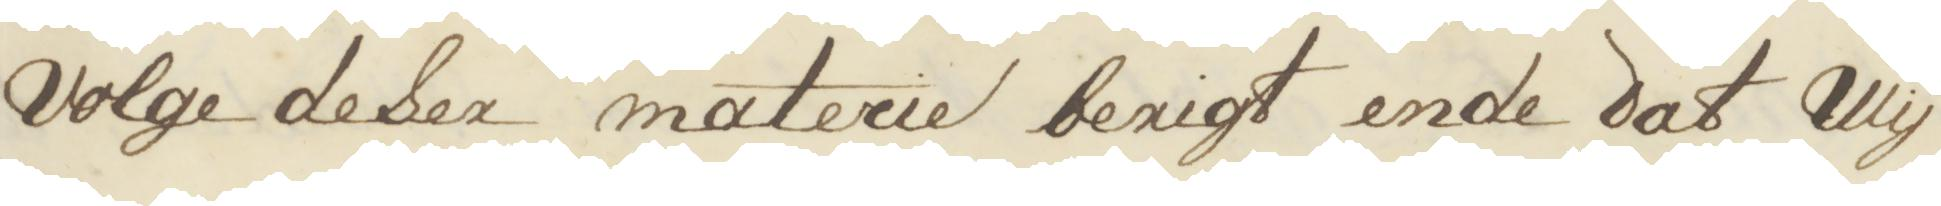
volge deser materie berigt ende dat wij
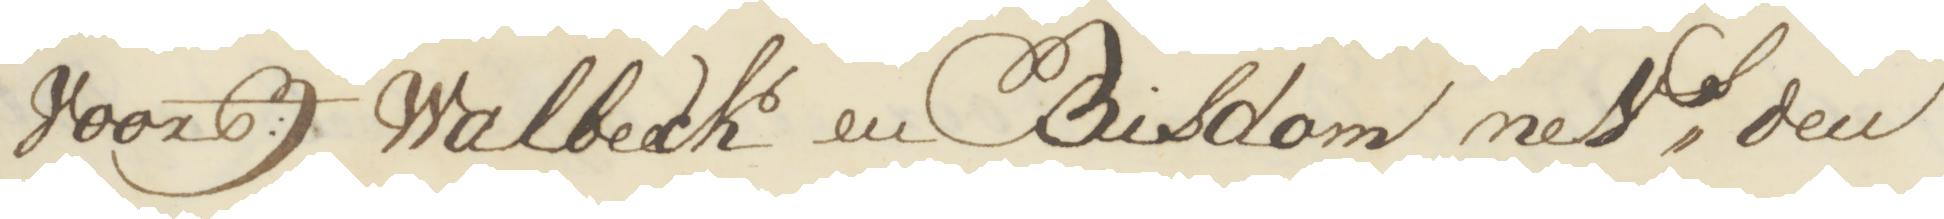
voorsz: walbeeck en Bisdom nev„s den
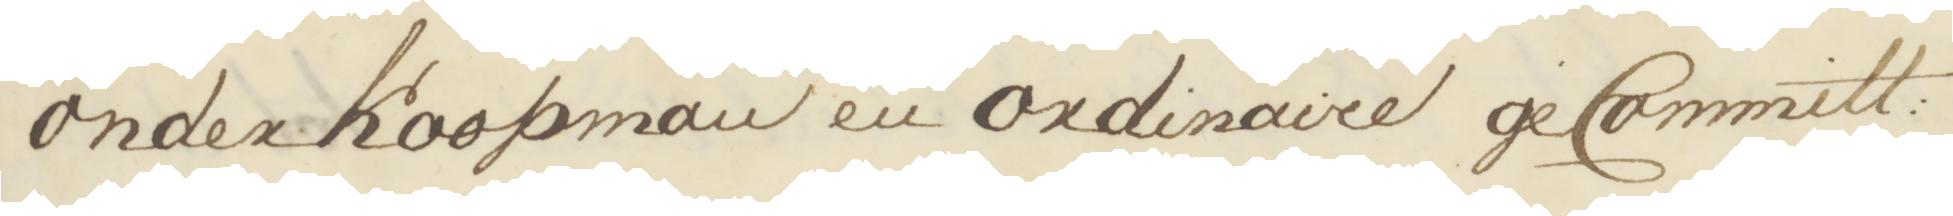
onderkoopman en ordinaire gecommitt:
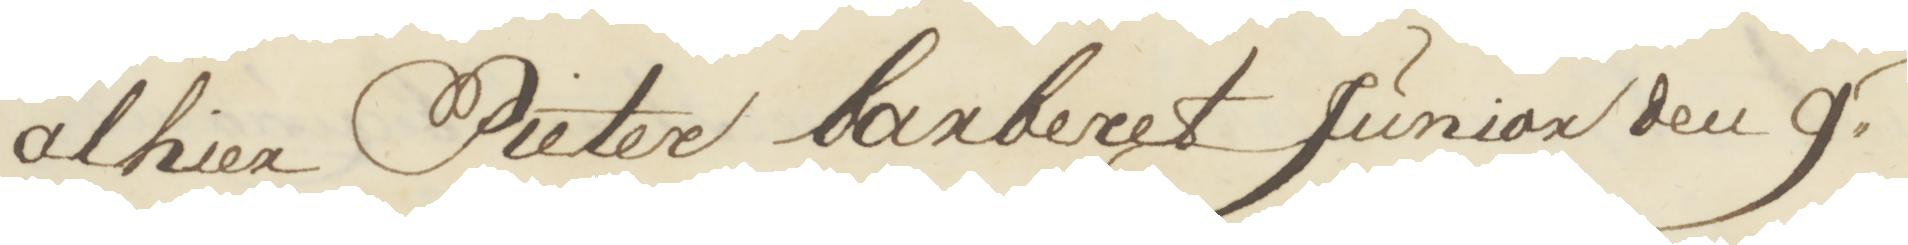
alhier Pieter barberet Junior den 9„'
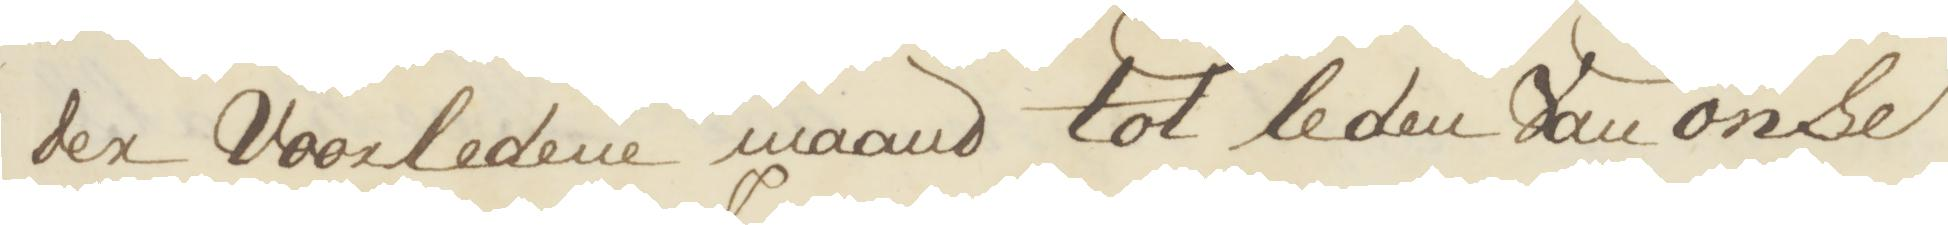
der Voorledene maand tot leden van onse
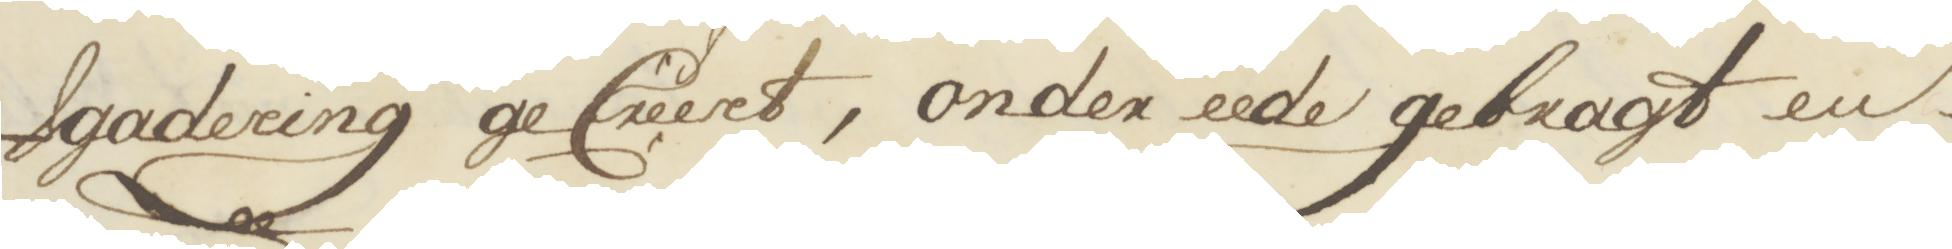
vergadering gecrêert, onder eede gebragt en
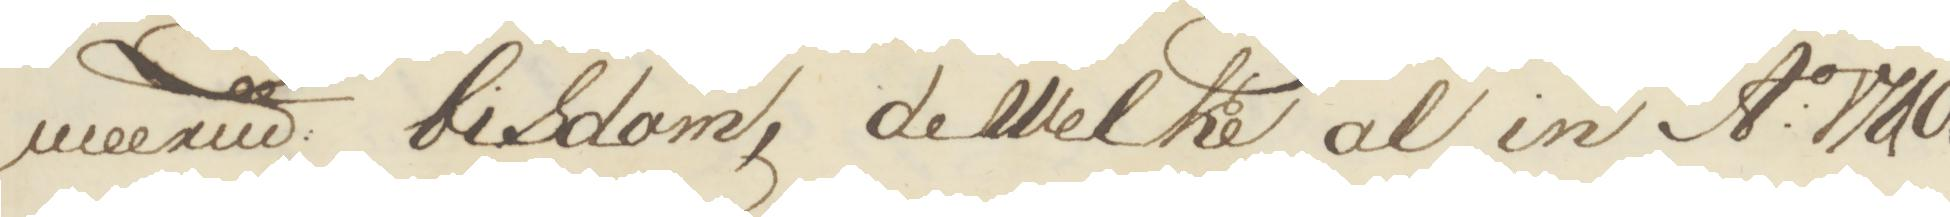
meernd:e bisdom, dewelke al in A:o 1740
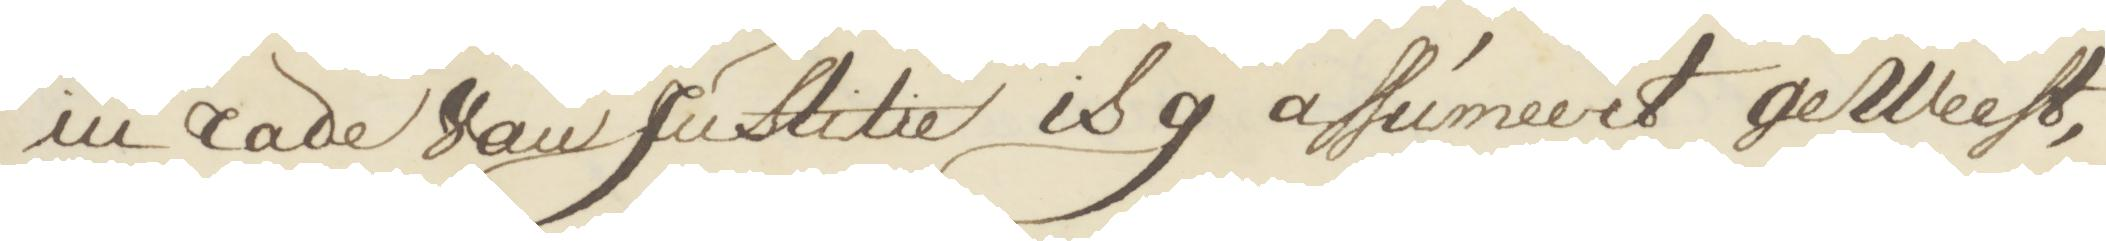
in rade van Justitie is g’ assumeert geweest,
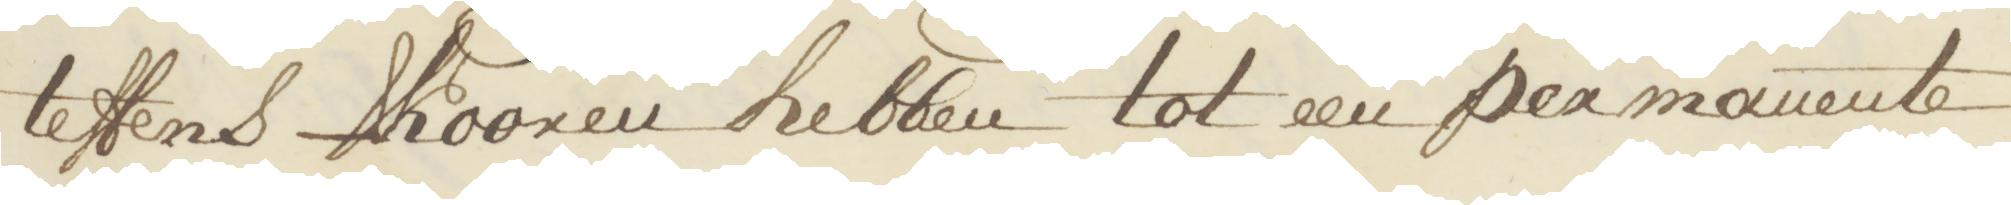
teffens verkooren hebben tot een permanente
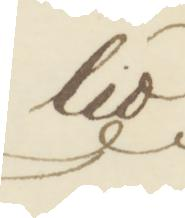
lid
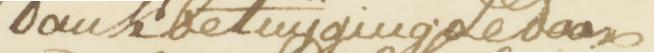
dankbetuijging de door
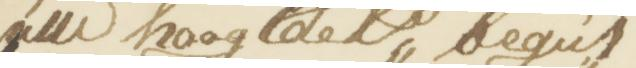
uw hoog Edel„s begus„
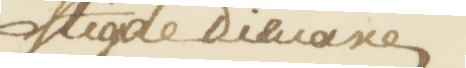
stigte dienaren
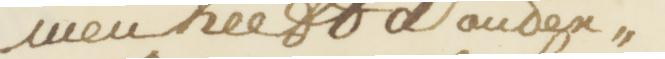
men heeft d'onder„
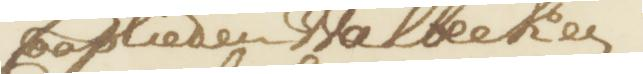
cooplieden walbeek en
